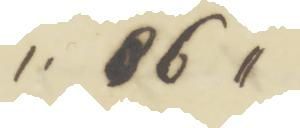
86 „
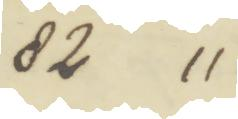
82 „
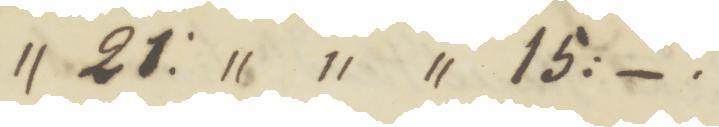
„ 21. „ „ „ 15.—.
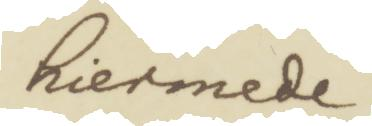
hiermede
